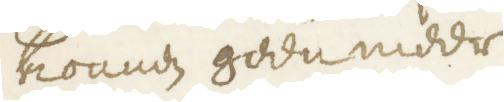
konnen geen meer
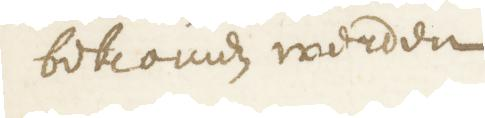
bekomen werden
